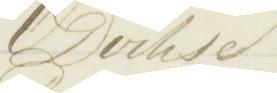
Dirkse
